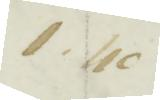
1.40
